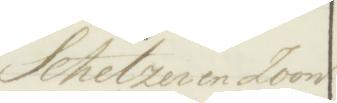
Schetzer en Zoon
